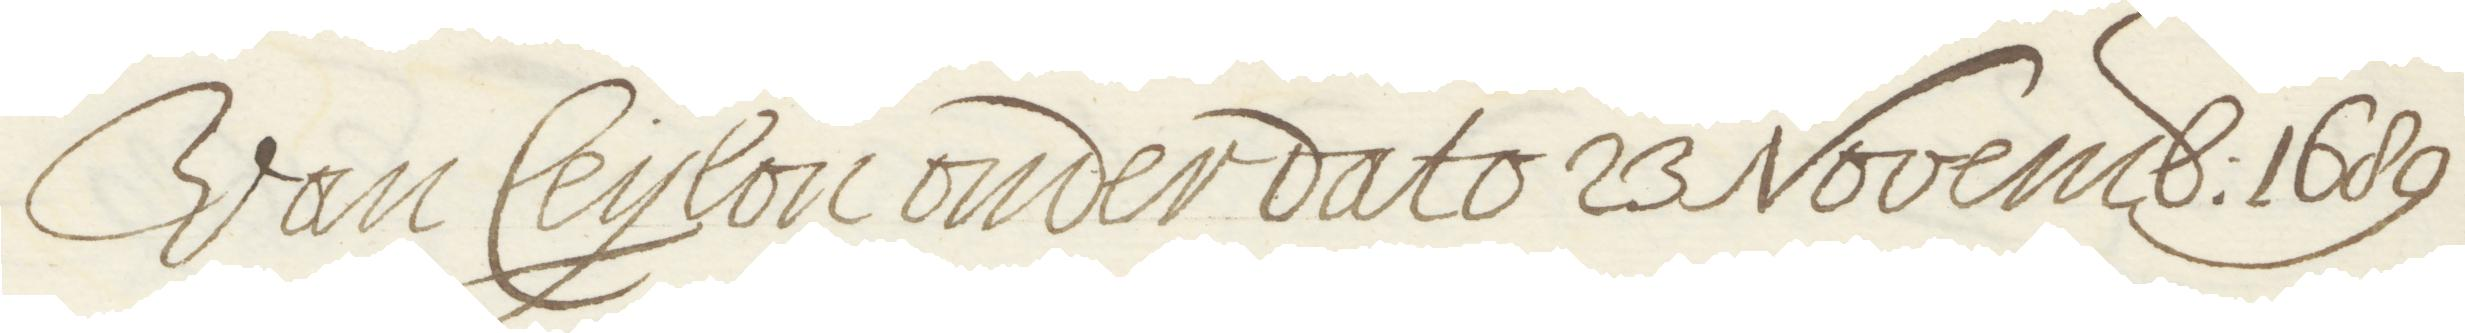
Van Ceijlon onder dato 23' Novemb: 1689
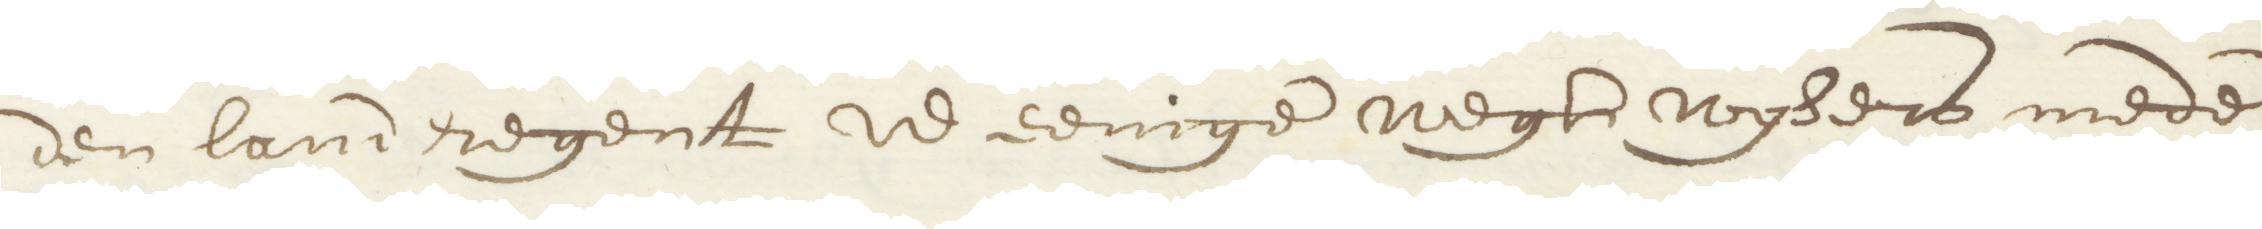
den land regent ze eenige wegh wijsers mede
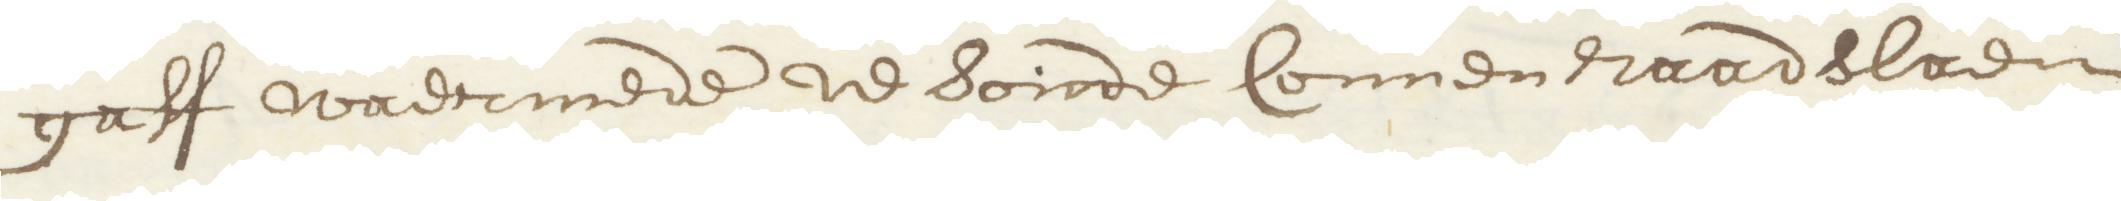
gaff waermede ze soude Connen raadslaen
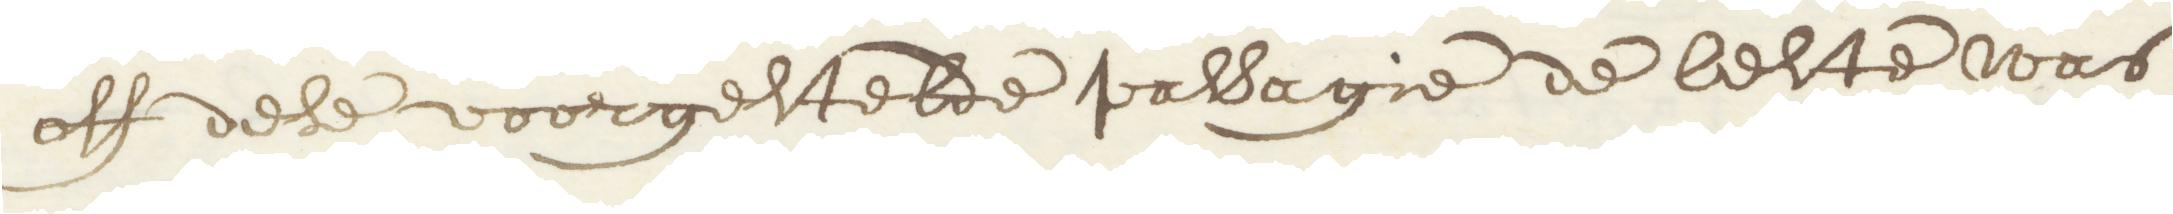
off dese voorgestelde passagie de beste was
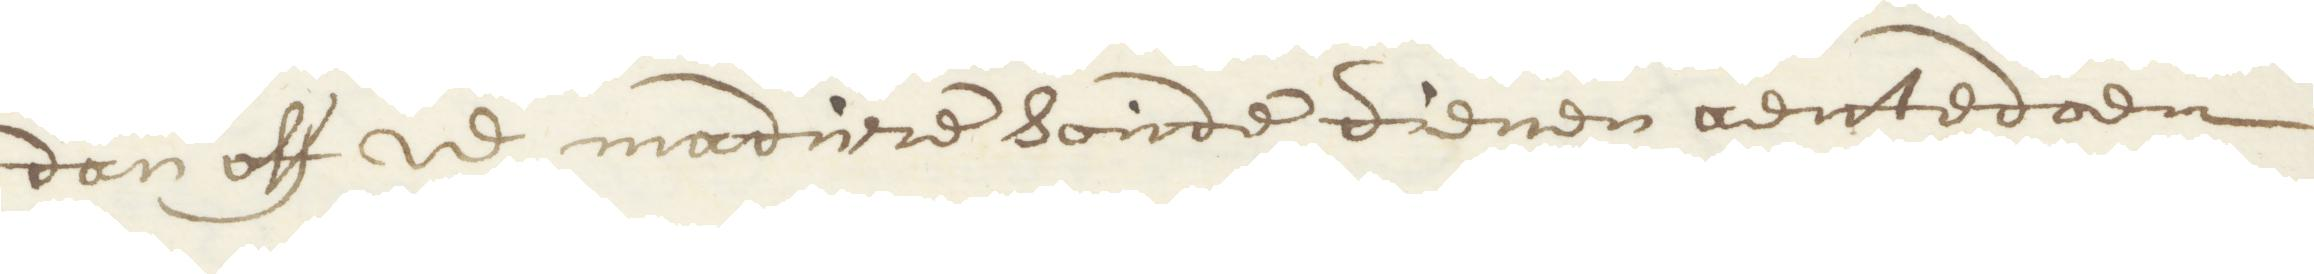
dan off te madure soude dienen aentedoen
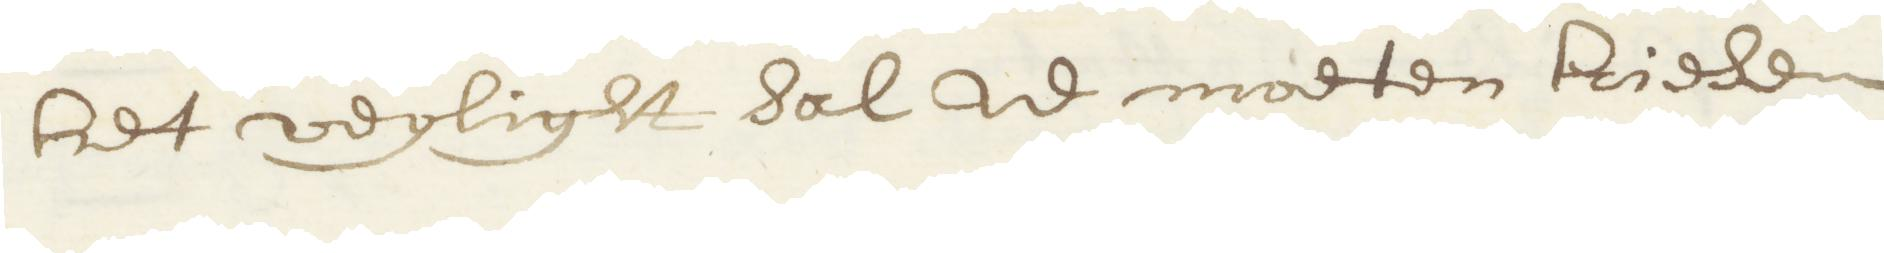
het veyligst sal te moeten kiesen
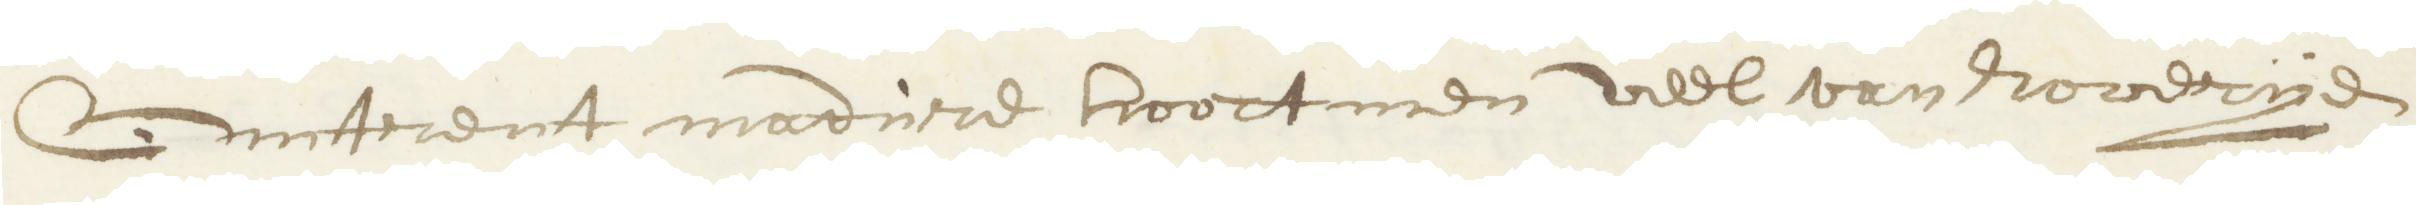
Omtrent madure hoort men veel van roverijen
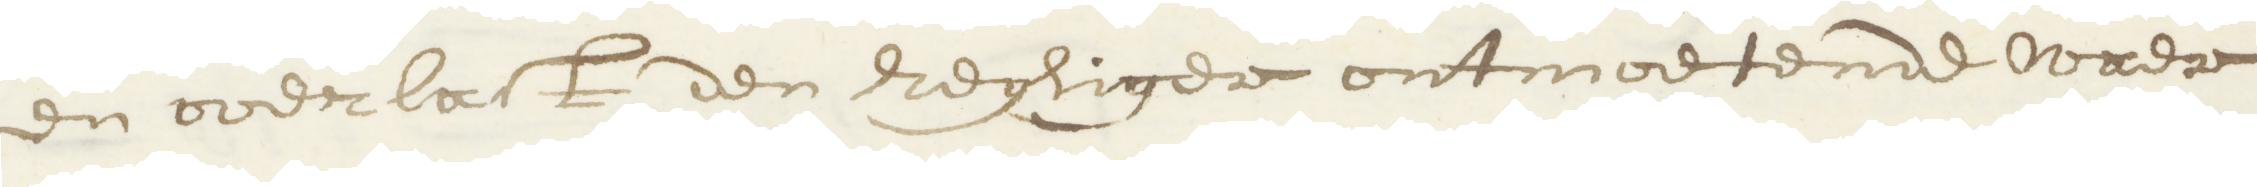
en overlast den reysiger ontmoetende waer
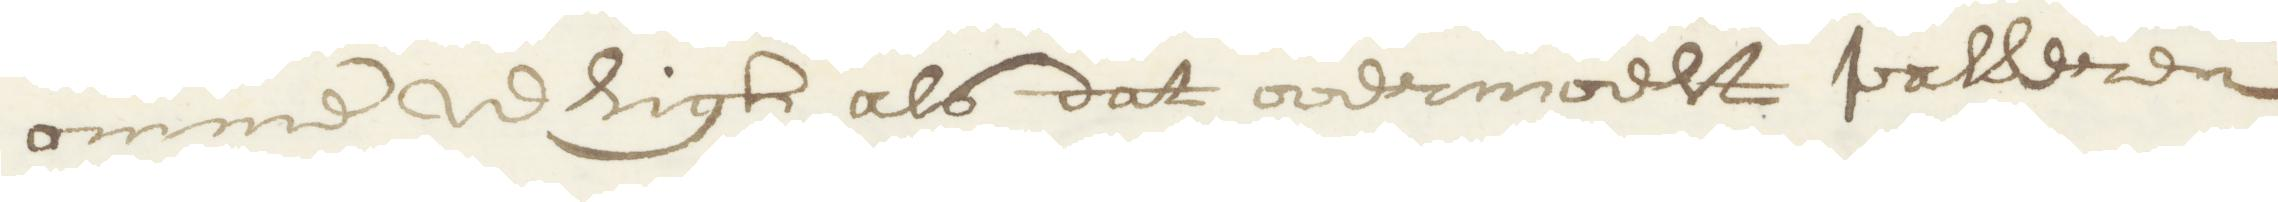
omme ze sigh als dat overmoest passeren
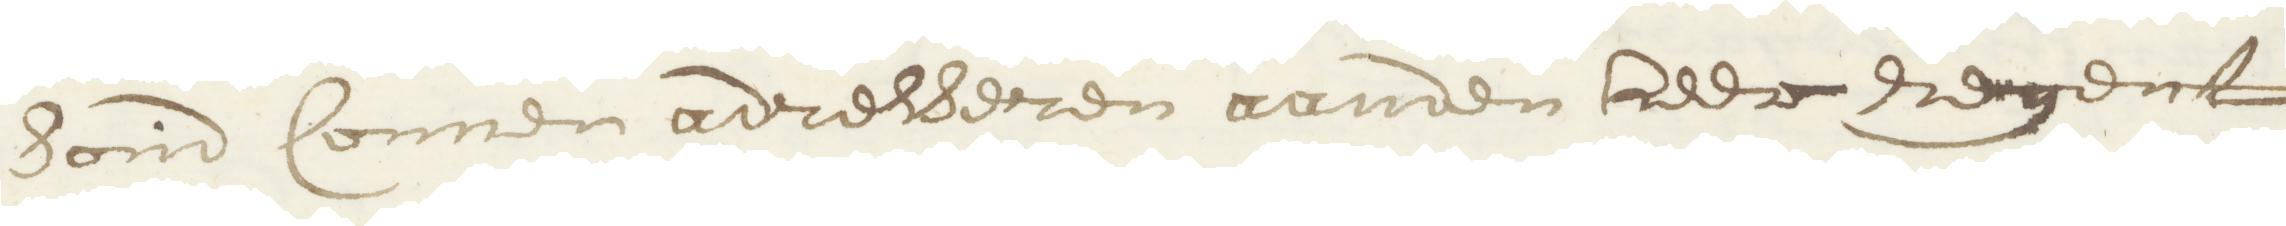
soud Connen adresseren aanden heer regent
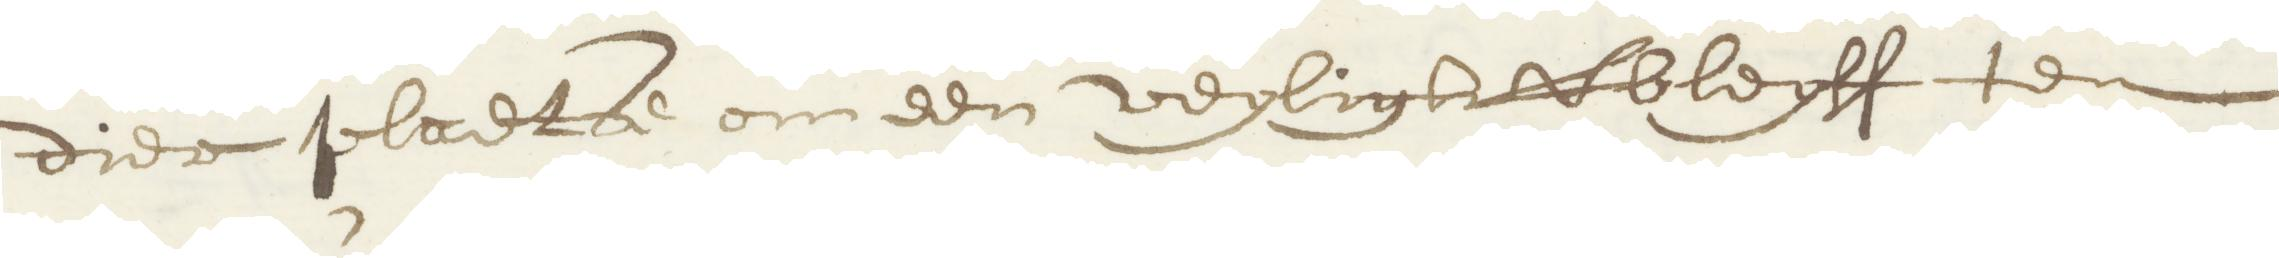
dier plaetse om een veyligh verbleyff ten
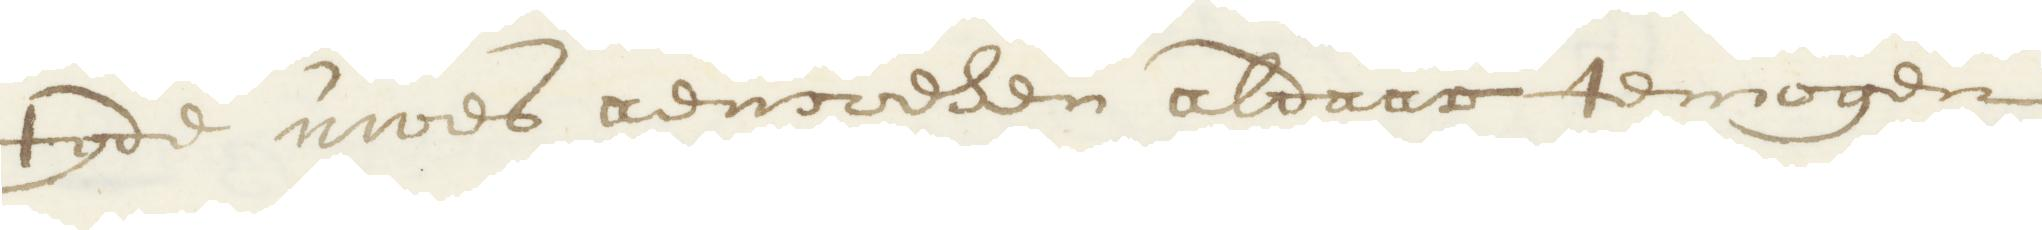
tijde uwes aenwesen aldaar temogen
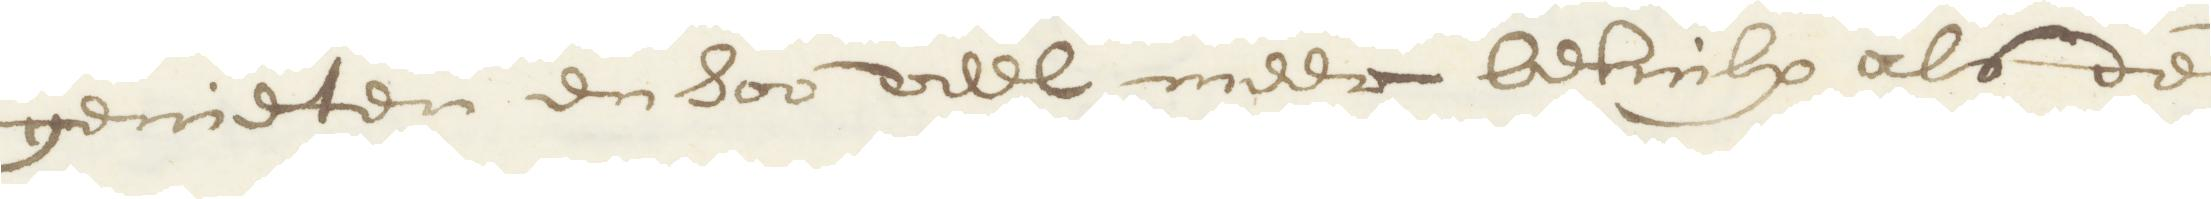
genieten en soo veel meer behulp als de
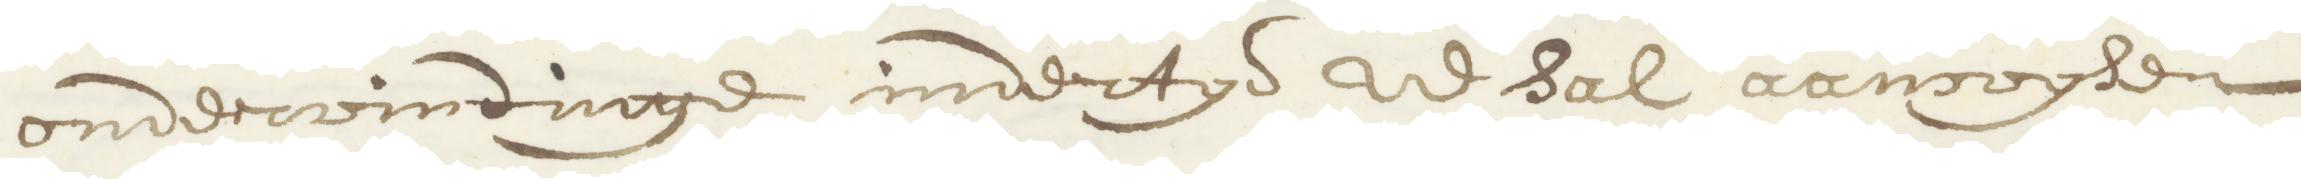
ondervindinge indertyd ze sal aanwijsen
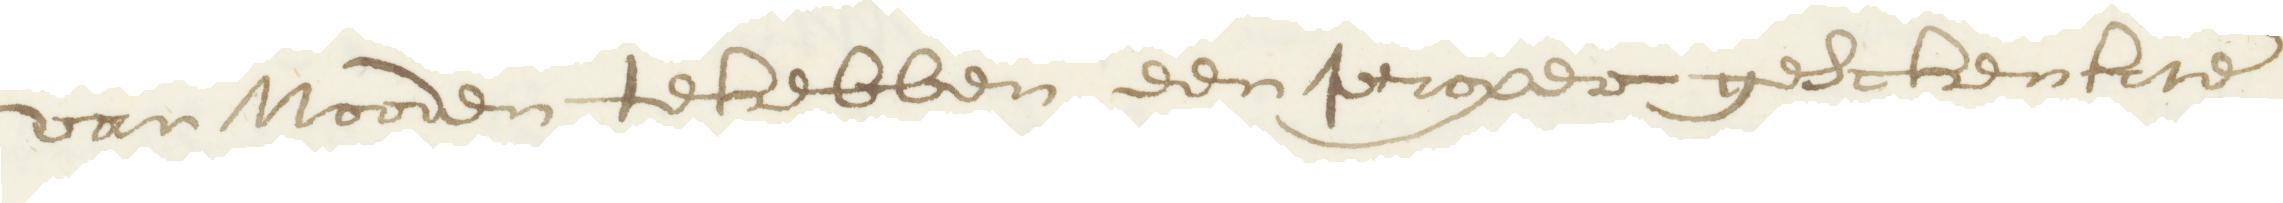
van Nooden tehebben een proper geschenkie
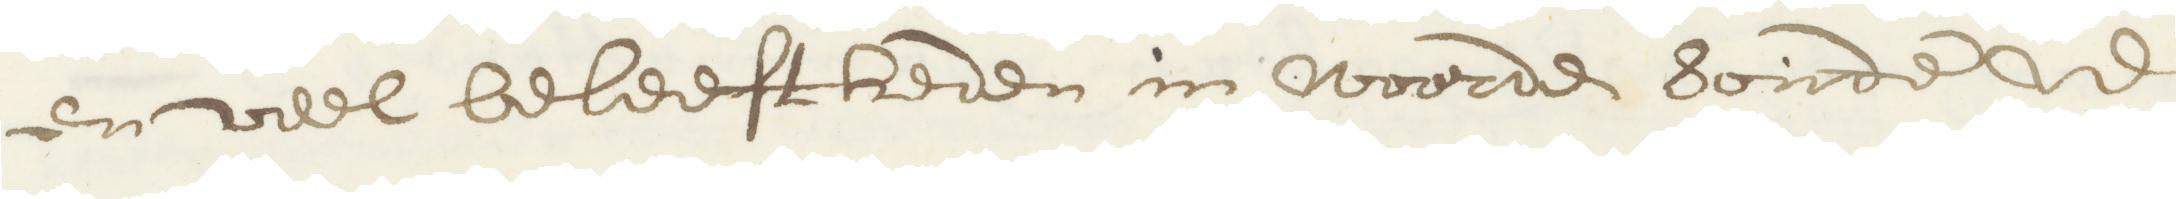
en veel beleeftheden in woorden soude te
